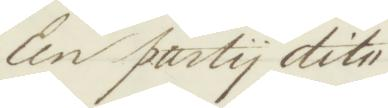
Een partij dito
